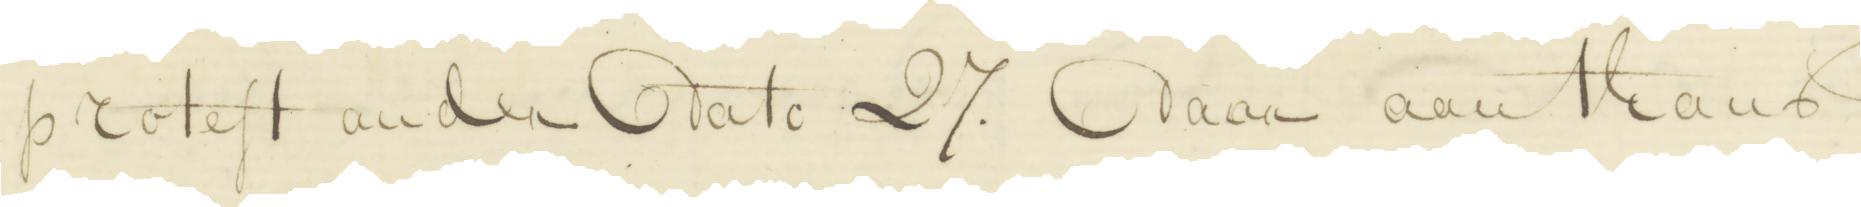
protest onder dato 27. daar aan thans
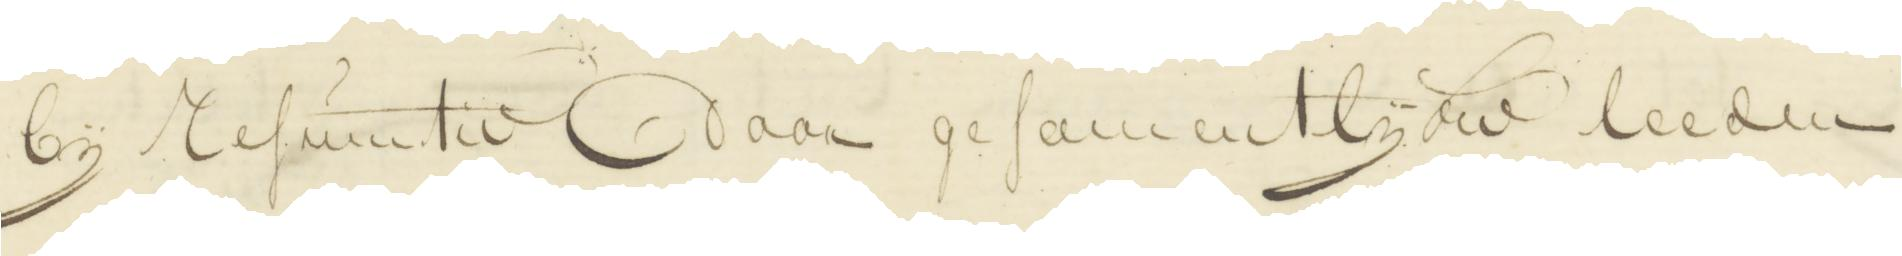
bij resumtie door gesamentlijke leeden
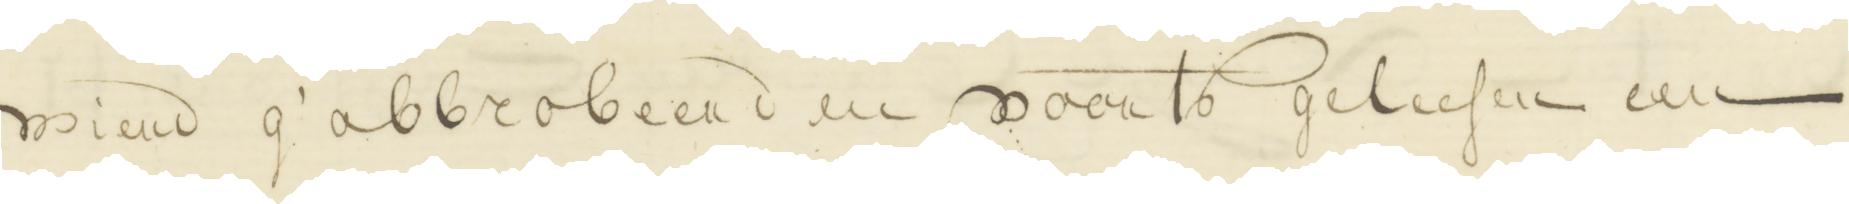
wierd g’abbrobeerd en voorts geleesen een
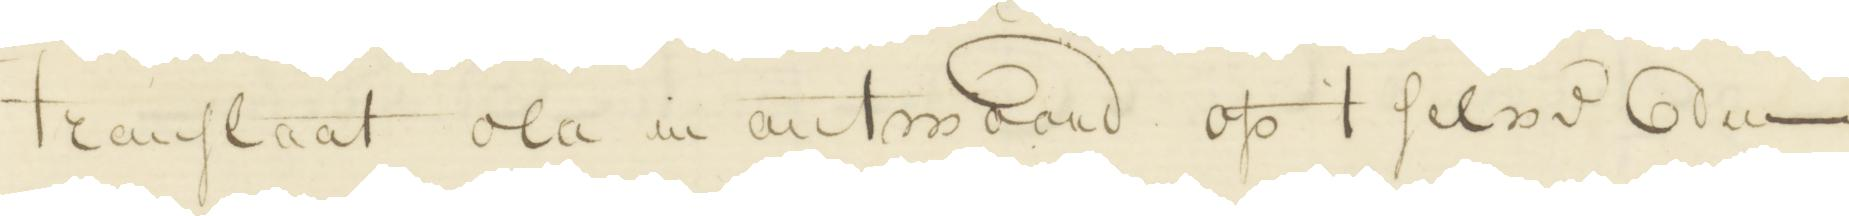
translaat ola in antwoord op ’t selve den
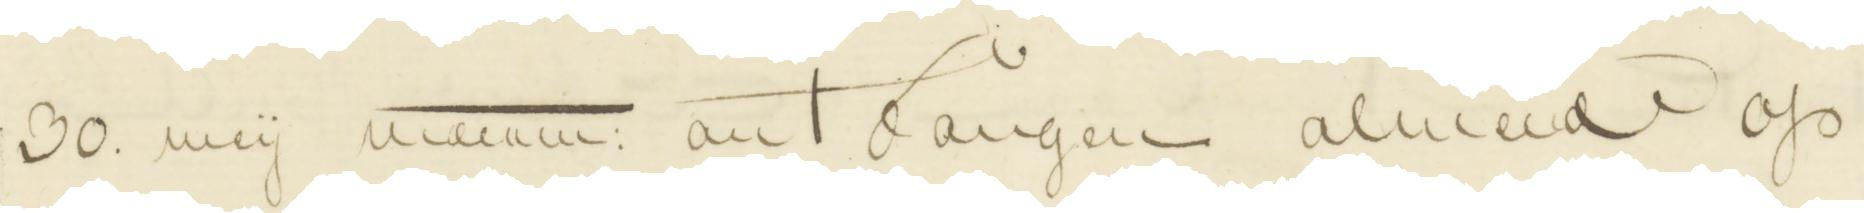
30. meij meerm: ontfangen almeede op
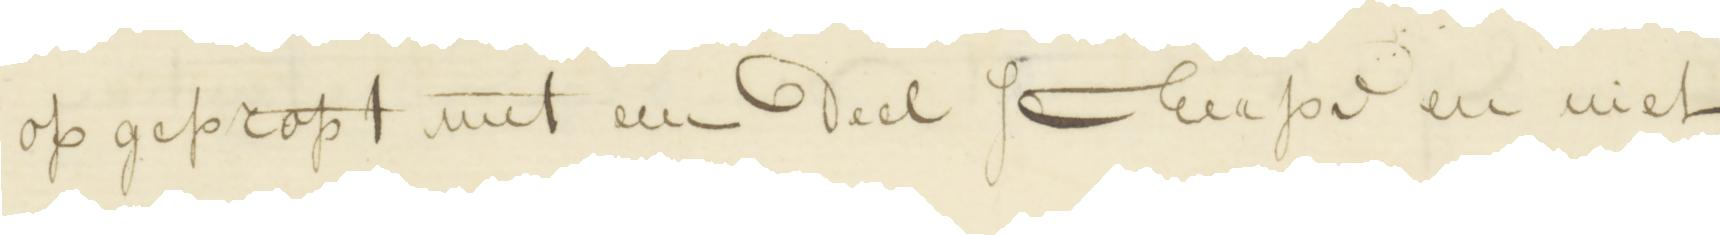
op gepropt met een deel scherpe en niet
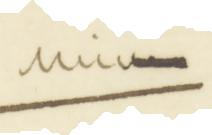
min
